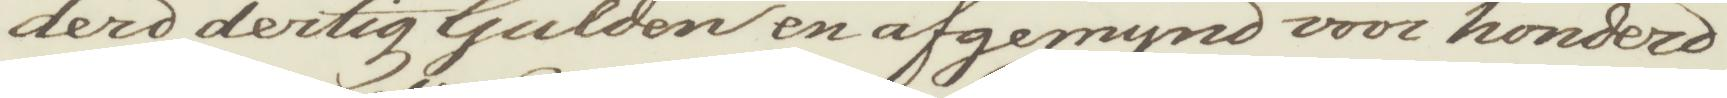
derd dertig Gulden en afgemynd voor honderd
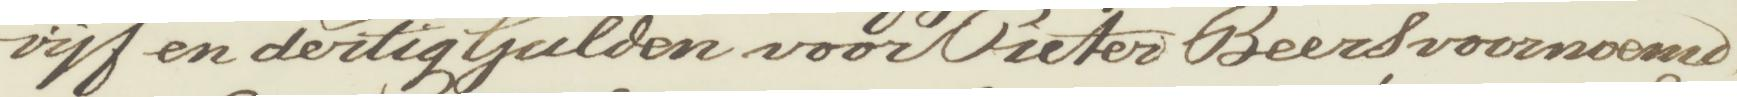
vijf en dertig Gulden voor Pieter Beers voornoemd
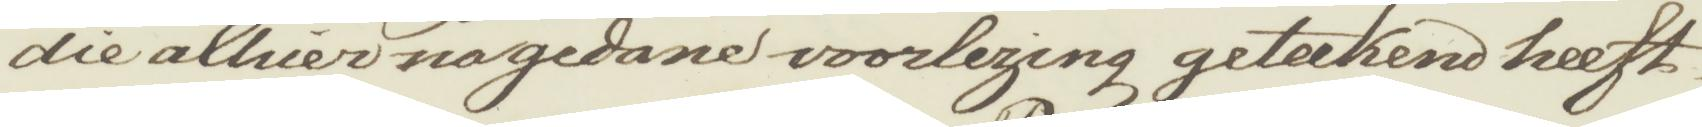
die alhier na gedane voorlezing geteekend heeft
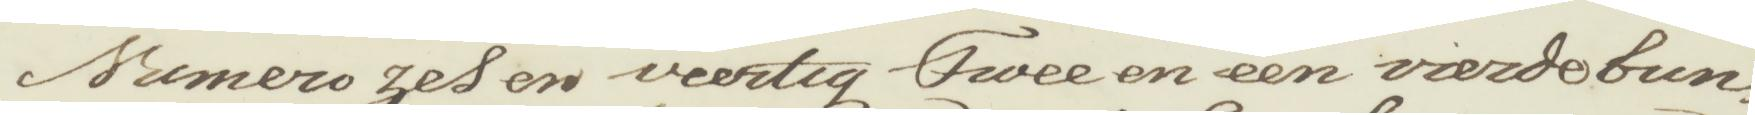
Numero zes en veertig Twee en een vierde bun
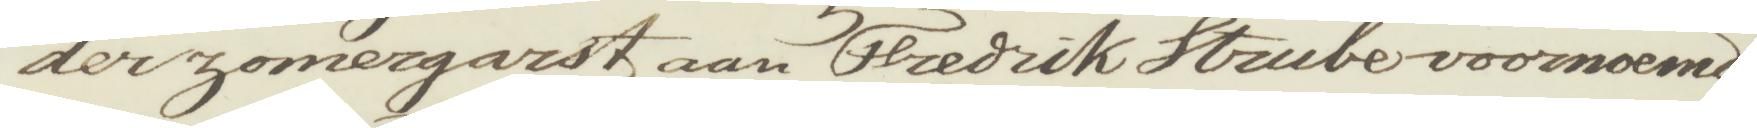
der zomergarst aan Fredrik Strube voornoemd
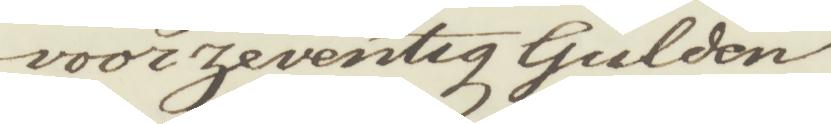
voor zeventig Gulden
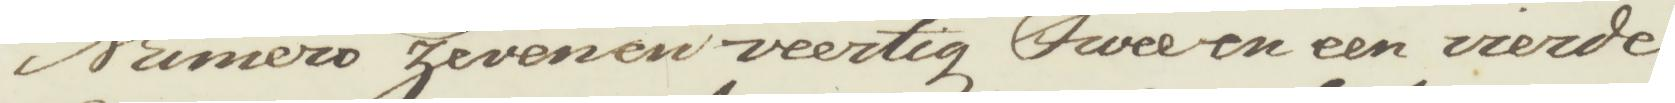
Numero zevenen veertig Twee en een vierde
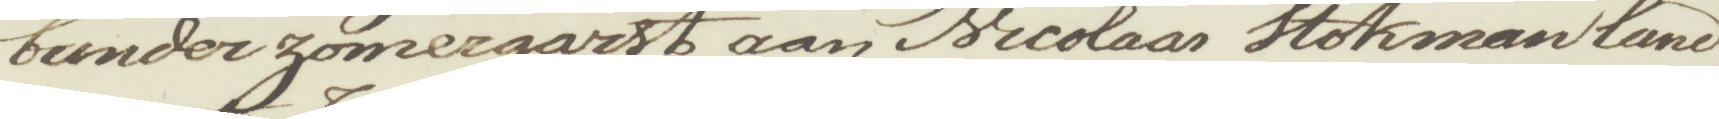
bunder zomergarst aan Nicolaas Stokman land
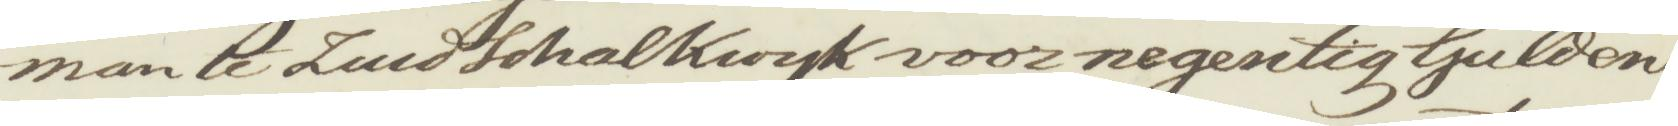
man te Zuid schalkwyk voor negentig Gulden
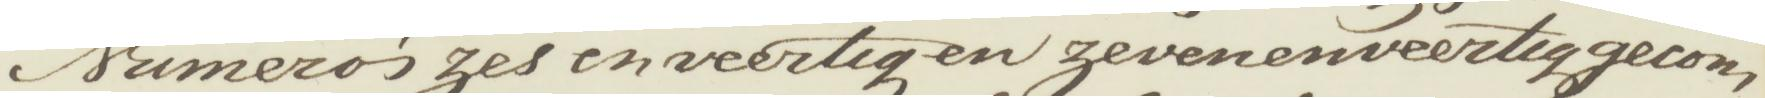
Numero's zes en veertig en zevenenveertig gecom
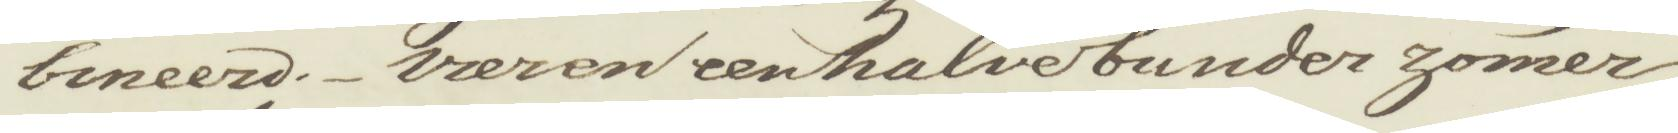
bineerd. - vieren een halve bunder zomer-
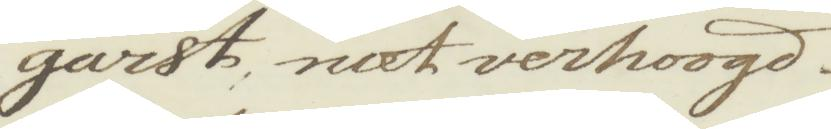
garst, niet verhoogd
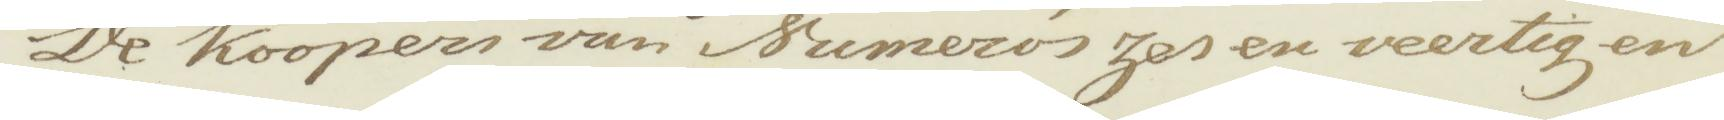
De koopers van Numero's zes en veertig en
